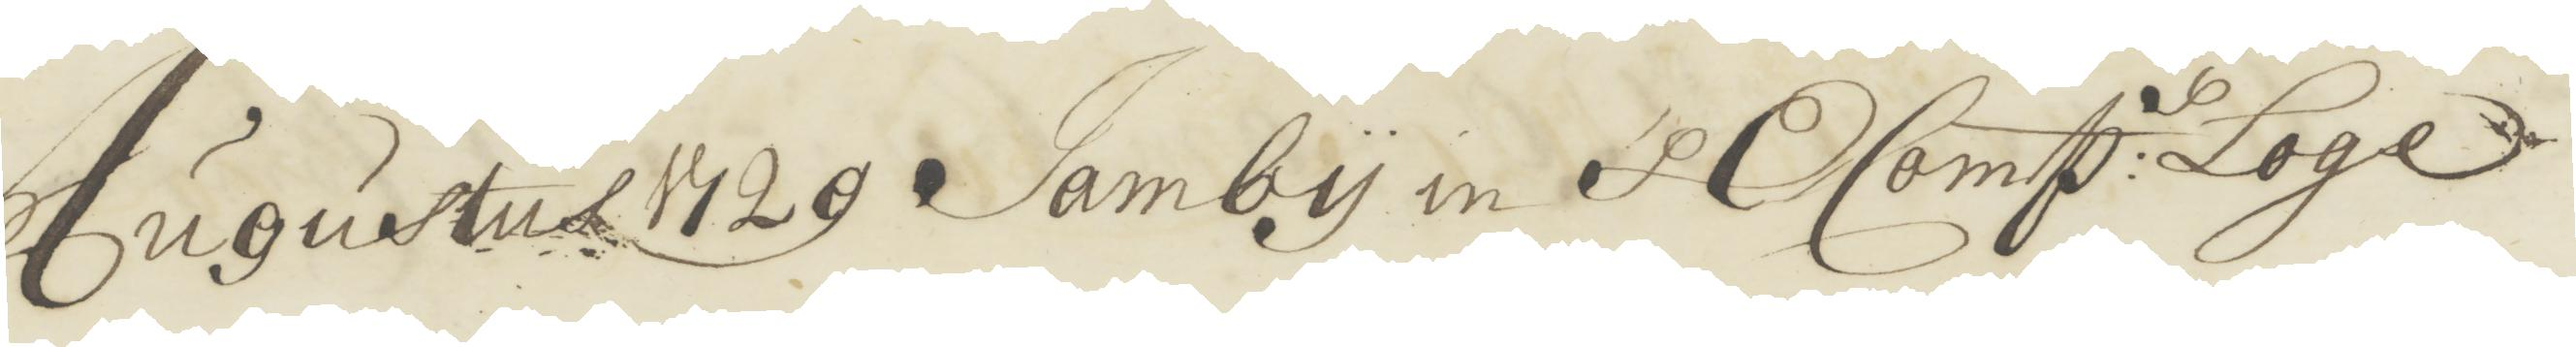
Augustus 1729 Jambij in 's E Comp:s Loge
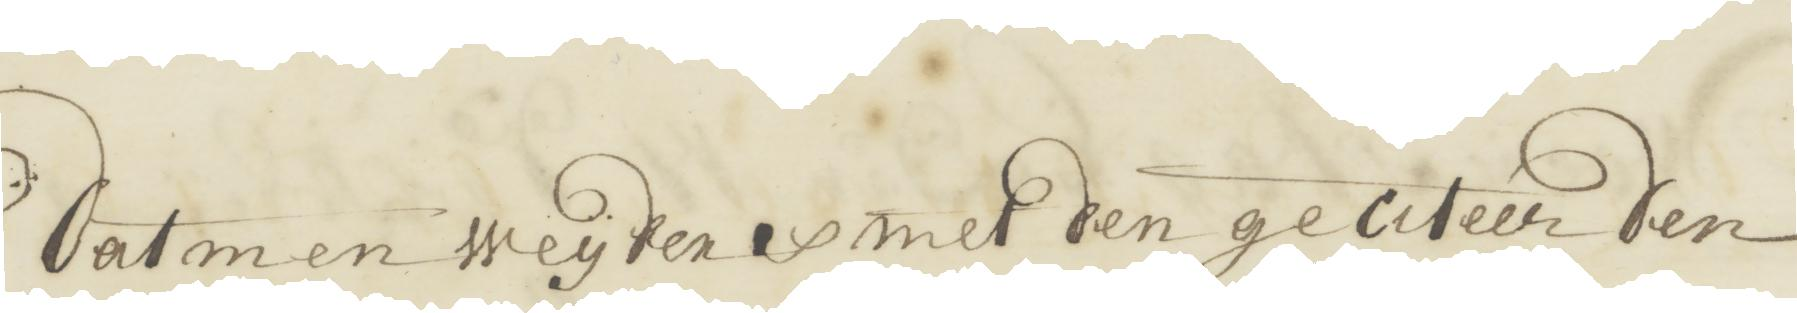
dat men weijders met den geciteerden
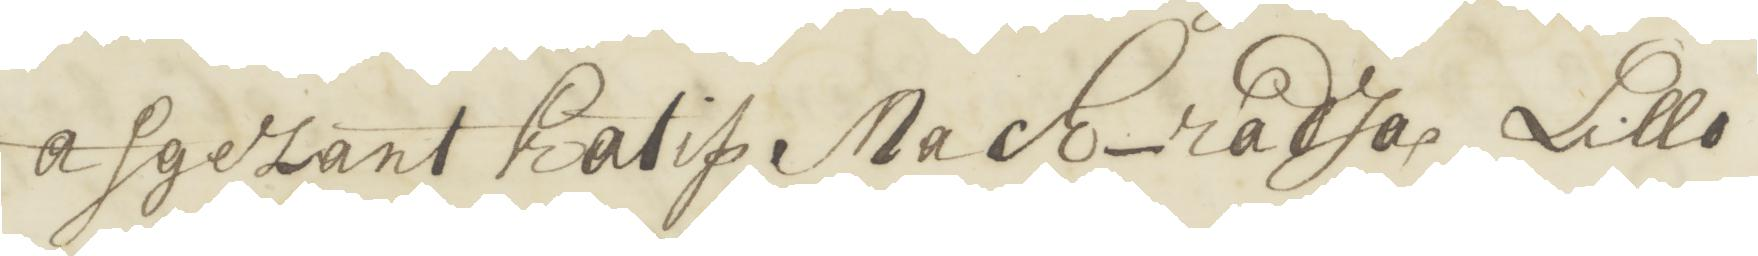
afgezant katip Mach-radja Lillo
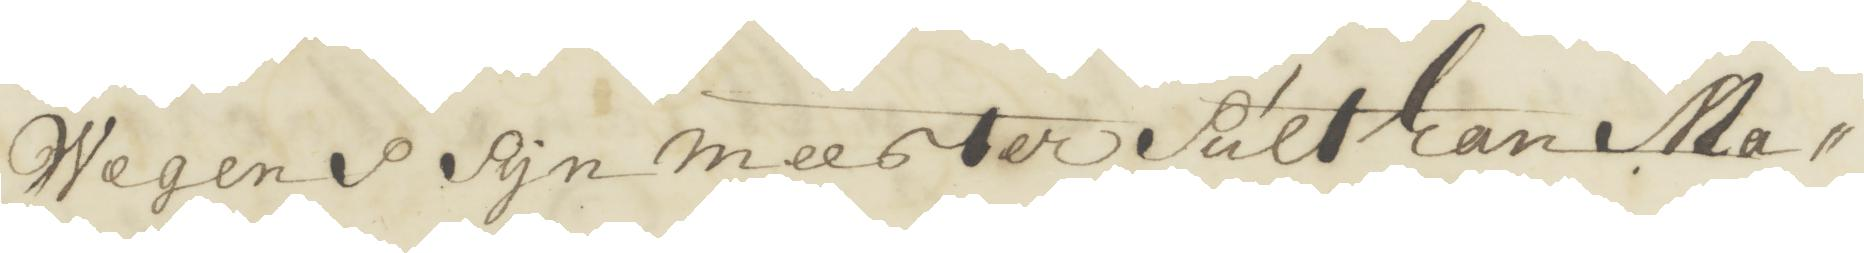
wegens sijn meester sulthan Ma„
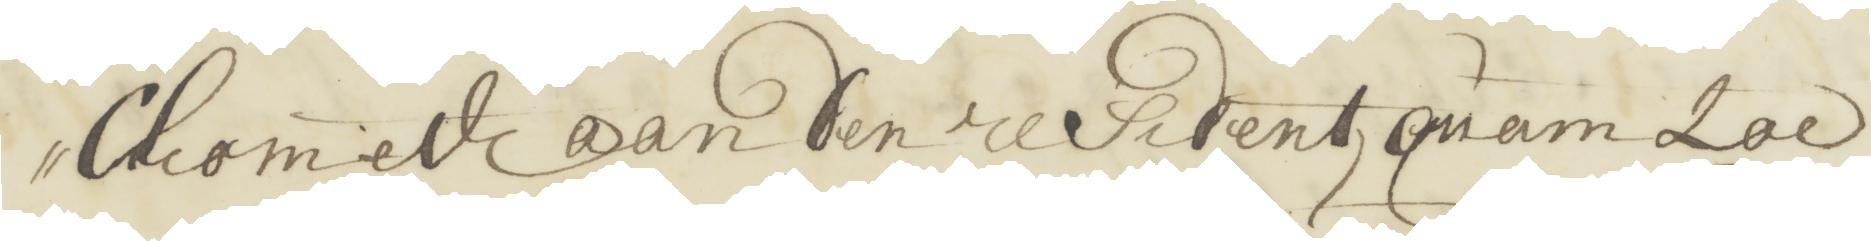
„chometh aan den resident quam toe
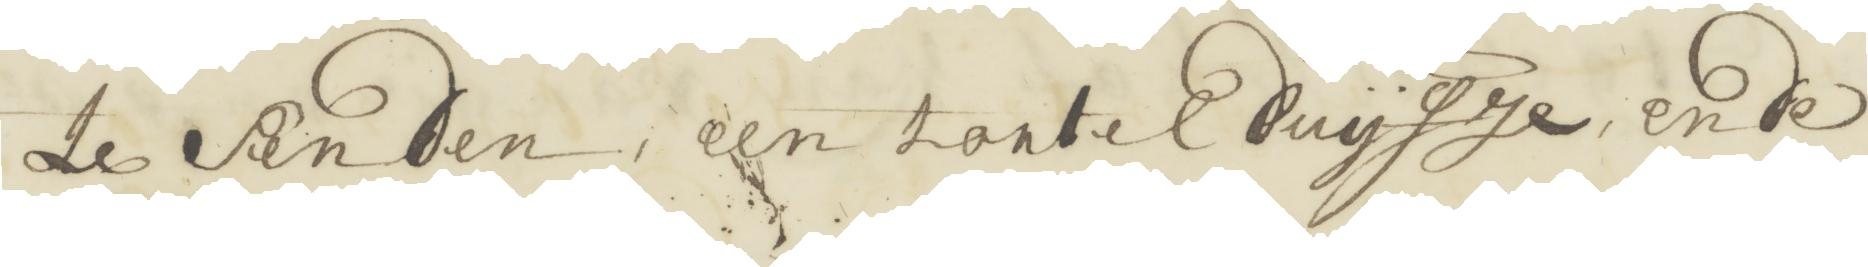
te senden, een tortel duijfje, en de
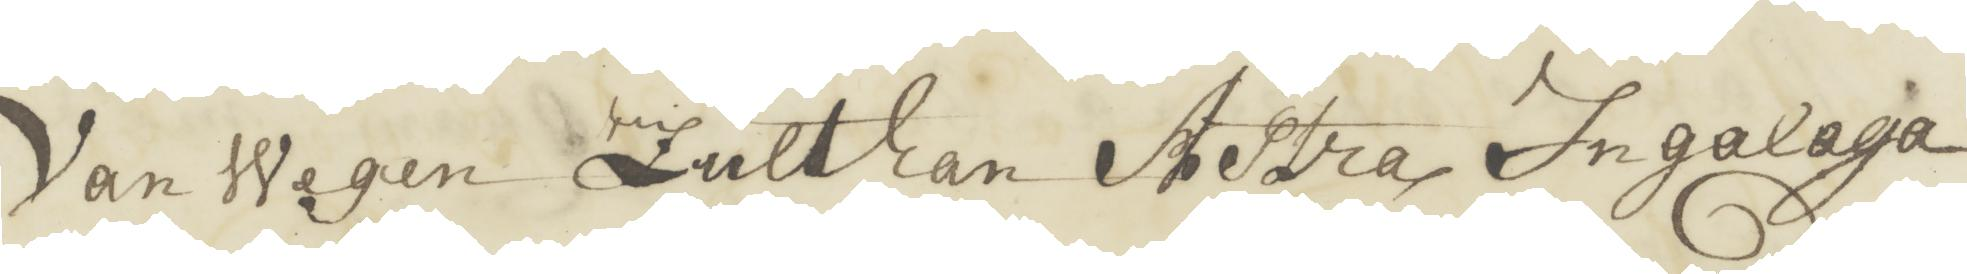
Van wegen Zulthan Astra Ingalaga
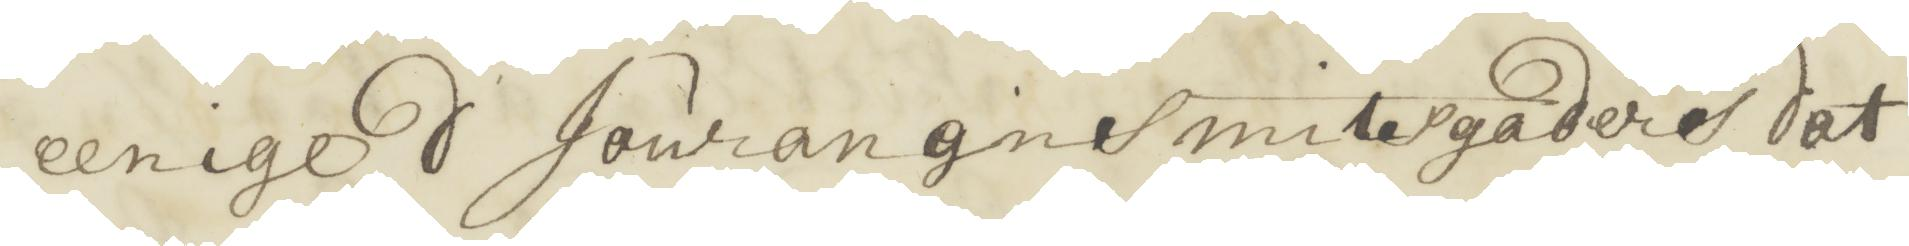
eenige d’ Jourangs mitsgaders dat
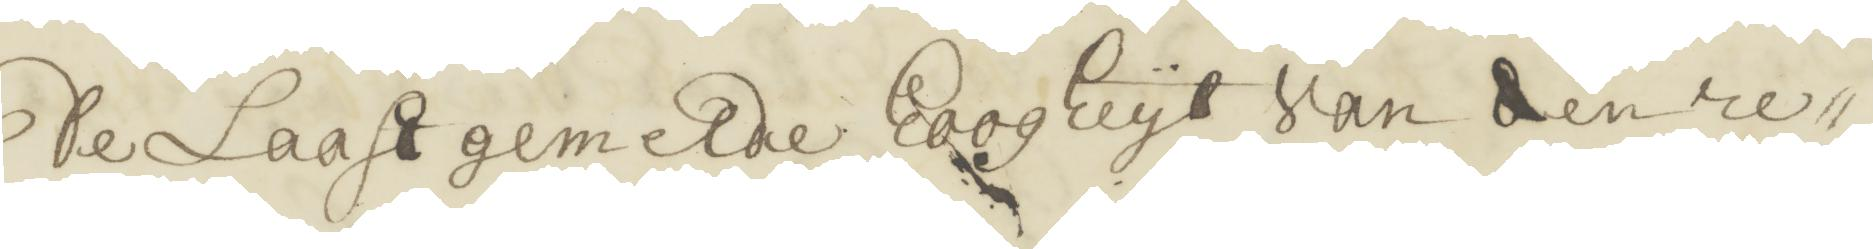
de laast gemelde hoogheijt van den re„
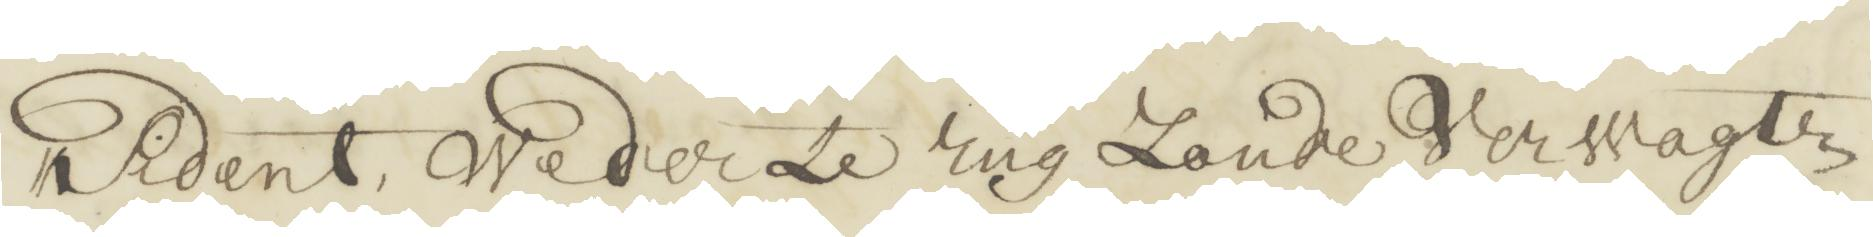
„sident, weder te rug zoude verwagten
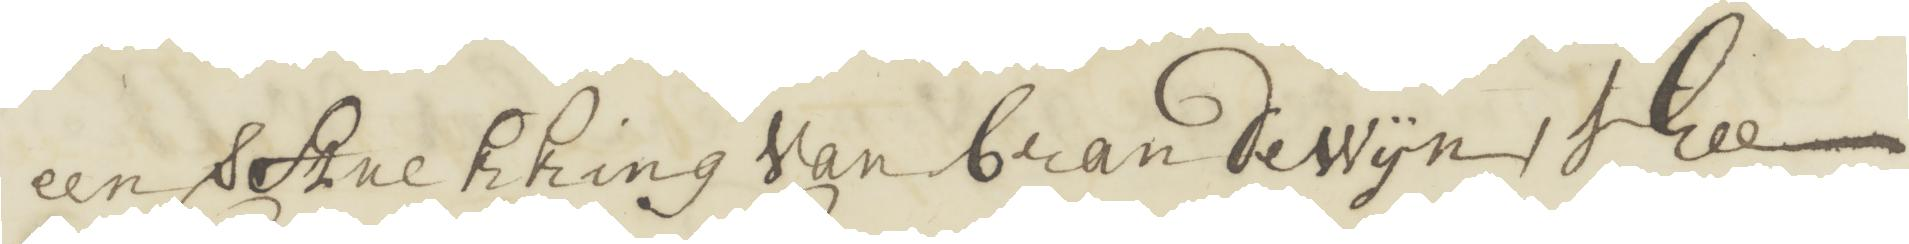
een verstrekking van brandewijn, thee
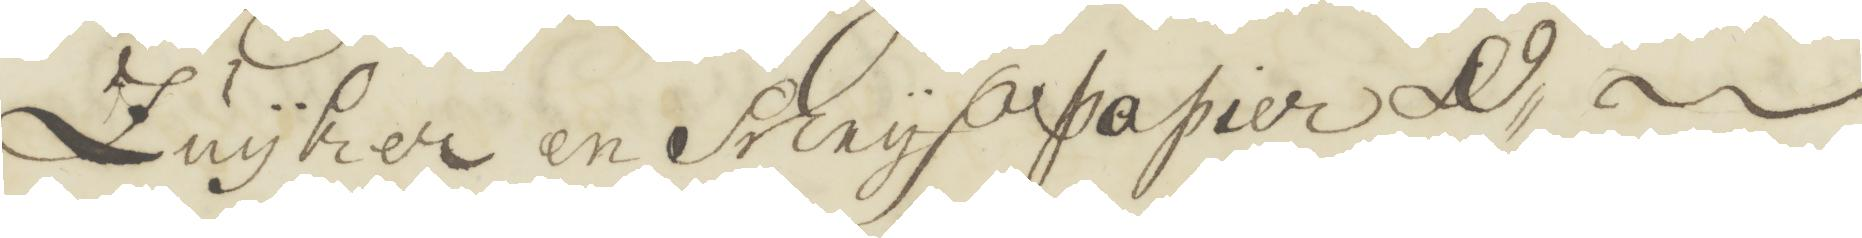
Zuijker en schrijfpapier D„o
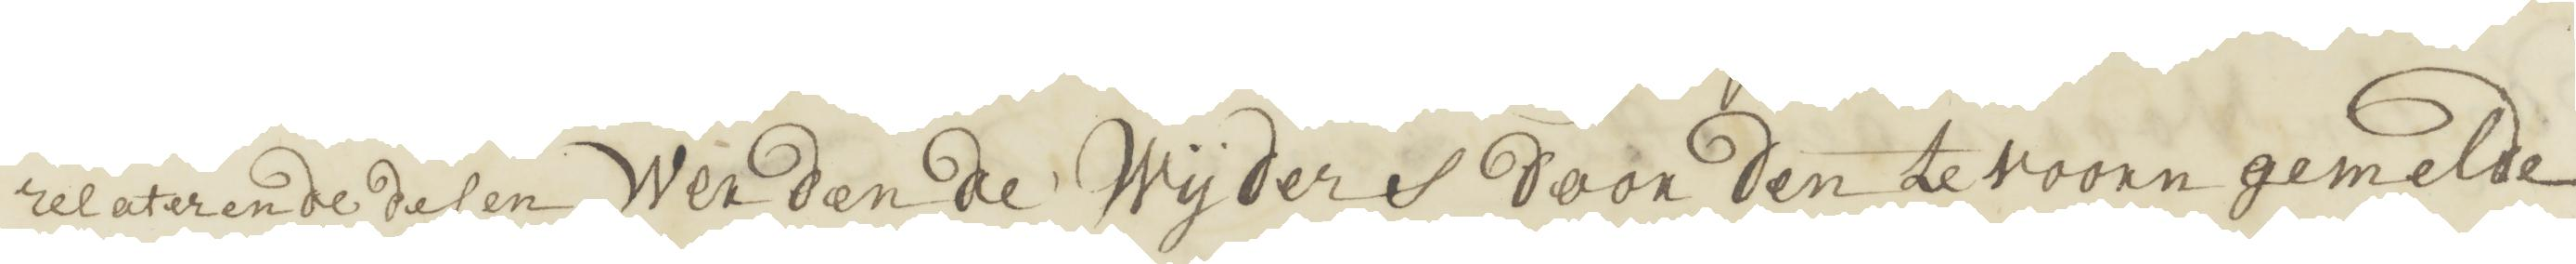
relaterende desen werden de wijders door den te voorn gemelde
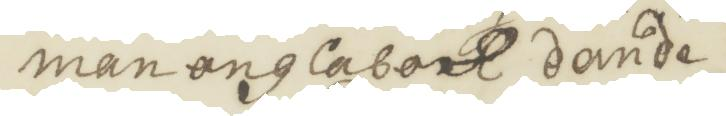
manongcabosch dan de
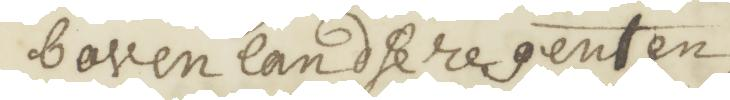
boven landse regenten
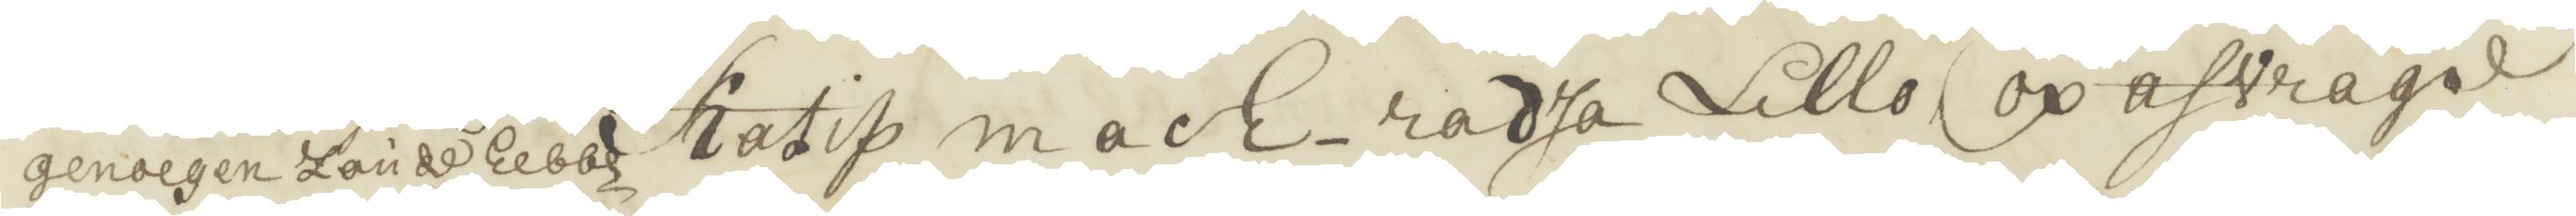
genoegen zoude hebben Katip mach-radja Zillo, op afvrage
